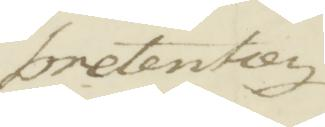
pretentien
